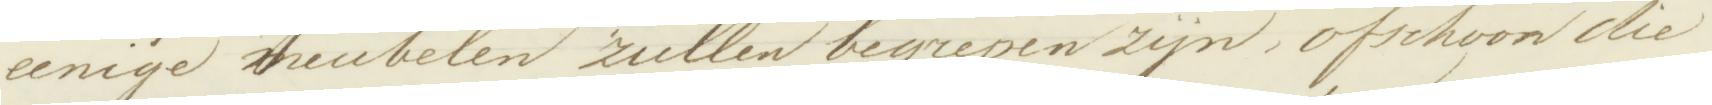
eenige meubelen zullen begrepen zijn, ofschoon die
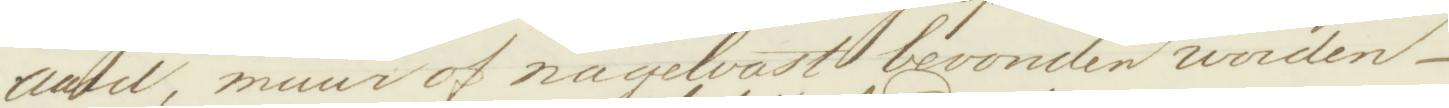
aard, muur of nagelvast bevonden worden-
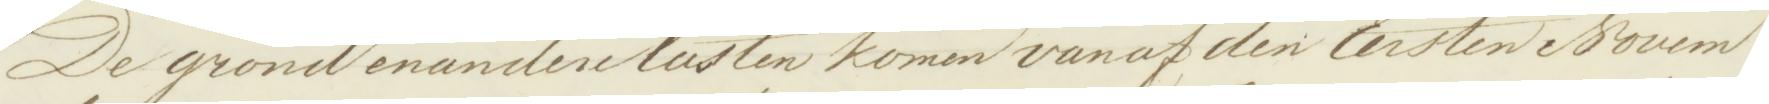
De grond en andere lasten komen van af den Eersten Novem
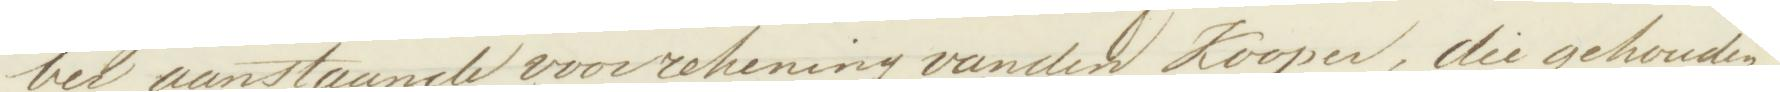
ber aanstaande voor rekening vanden Kooper, die gehouden
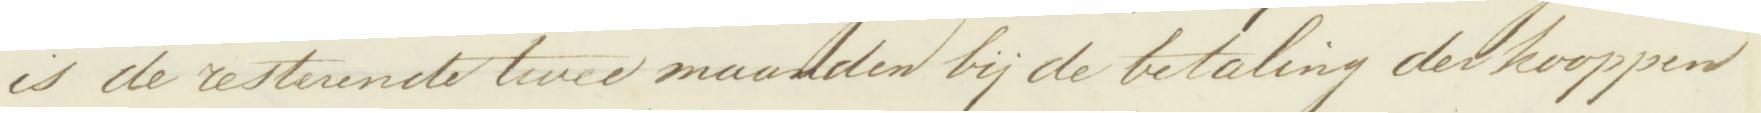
is de resterende twee maanden bij de betaling der kooppen
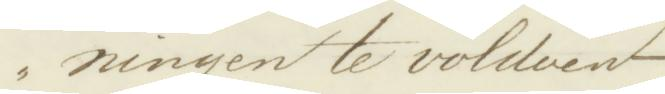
„ningen te voldoen
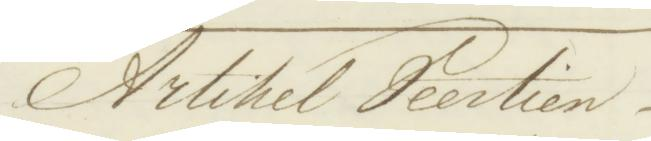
Arthet Veertien
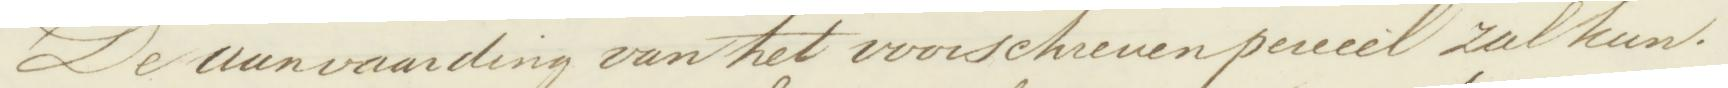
De aanvaarding van het voorschreven perceel zal kun„
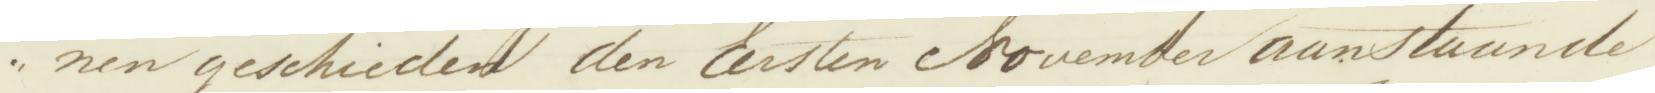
„nen geschieden den Eersten November aanstaande
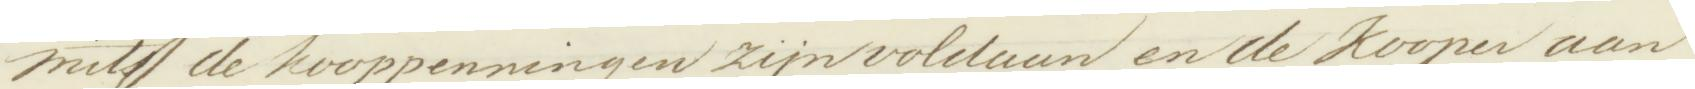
mits de kooppenningen zijn voldaan en de kooper aan
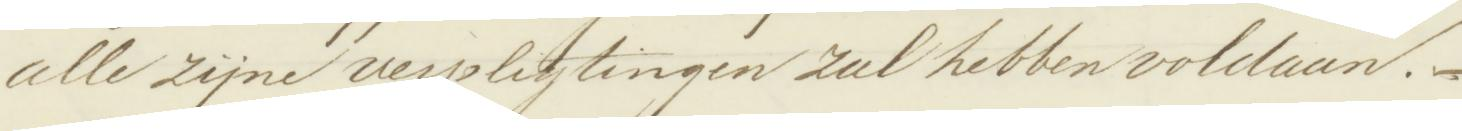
alle zijne verpligtingen zal hebben voldaan.
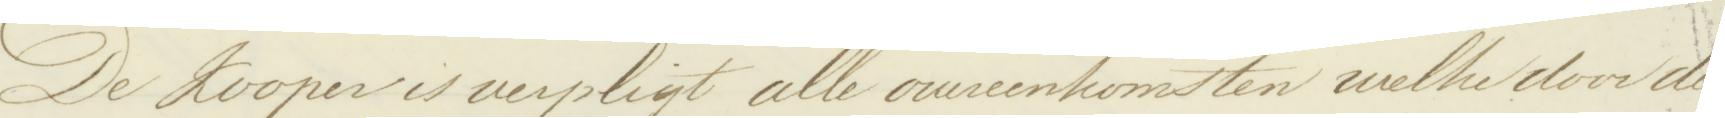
De Kooper is verpligt alle overeenkomsten welke door de
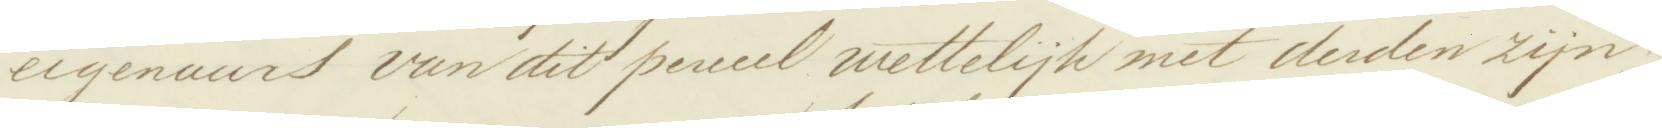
eigenaars van dit perceel wettelijk met derden zijn
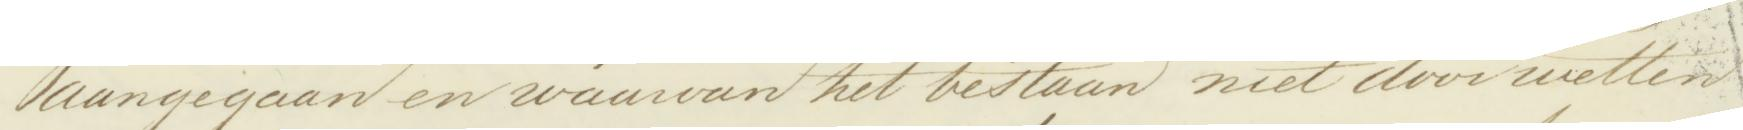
aangegaan en waarvan het bestaan niet door wetten
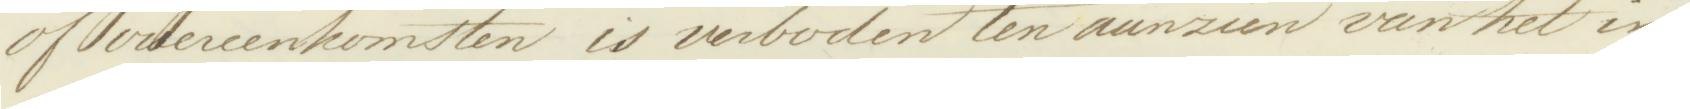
of overeenkomsten is verboden ten aanzien van het in
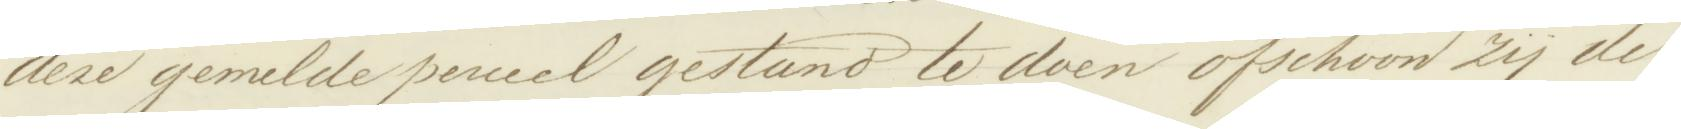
deze gemelde perceel gestand te doen ofschoon zij de
